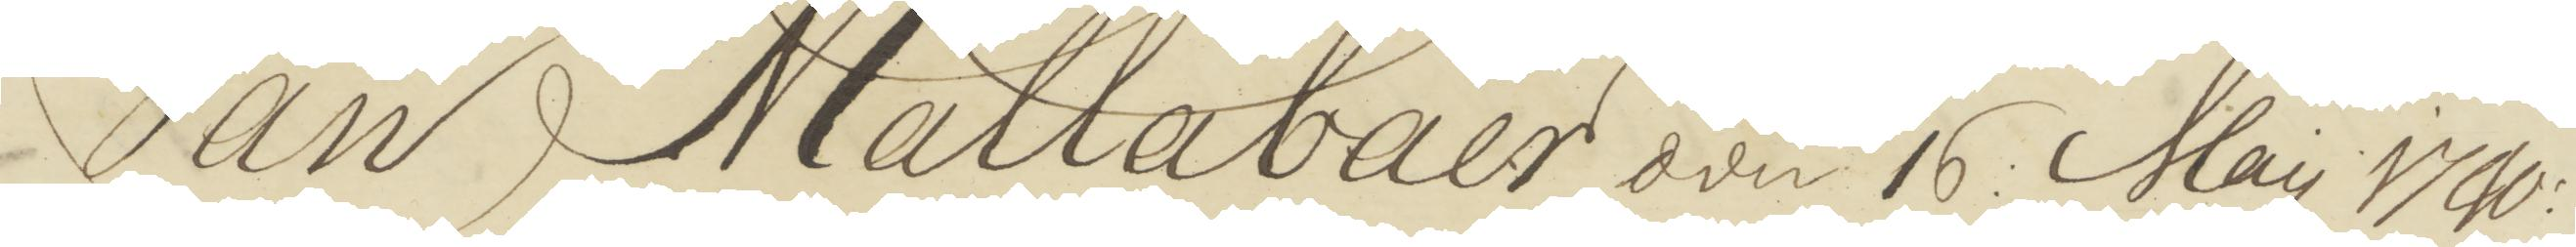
Van Mallabaer den 16: Maij 1740:
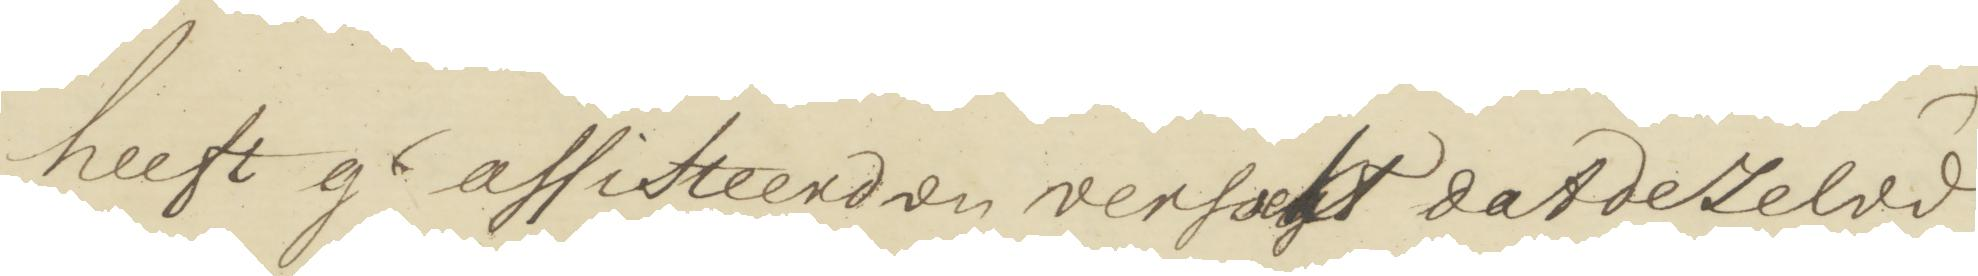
heeft g' assisteerden versoekt dat dezelve
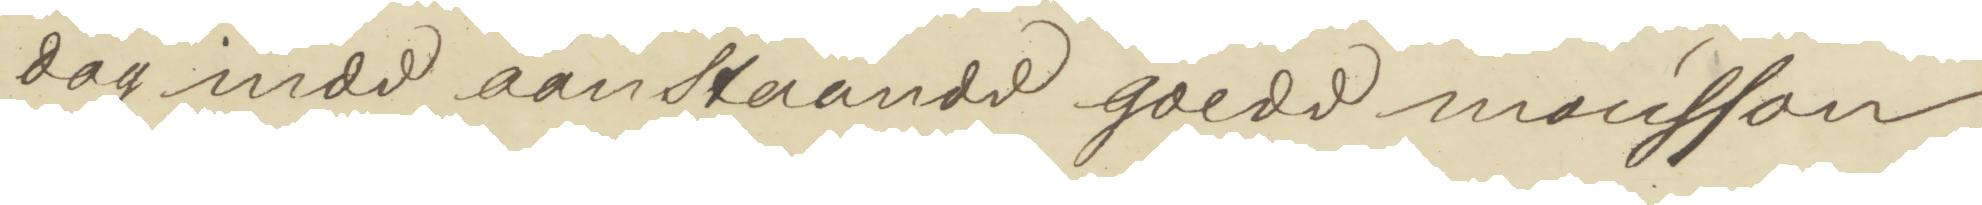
dog inde aanstaande goede mousson
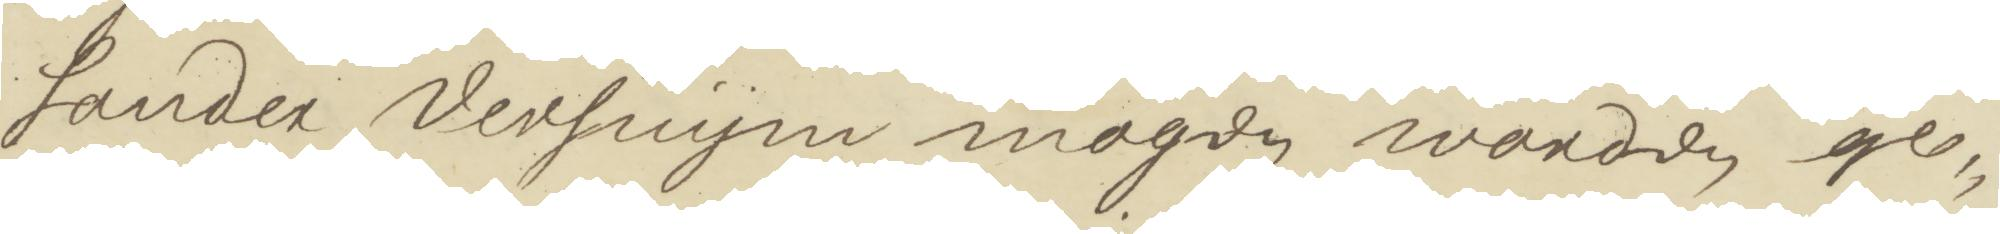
sonder versuijm mogen worden ge„
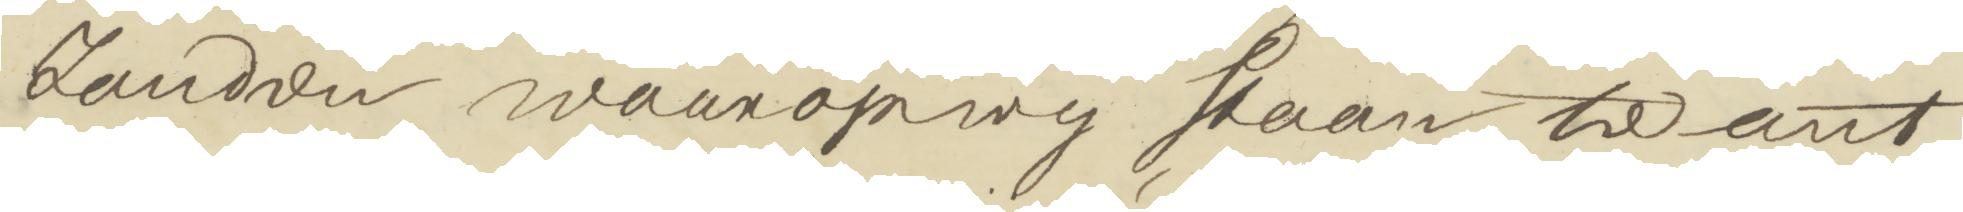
zonden waarop wij staan te ant
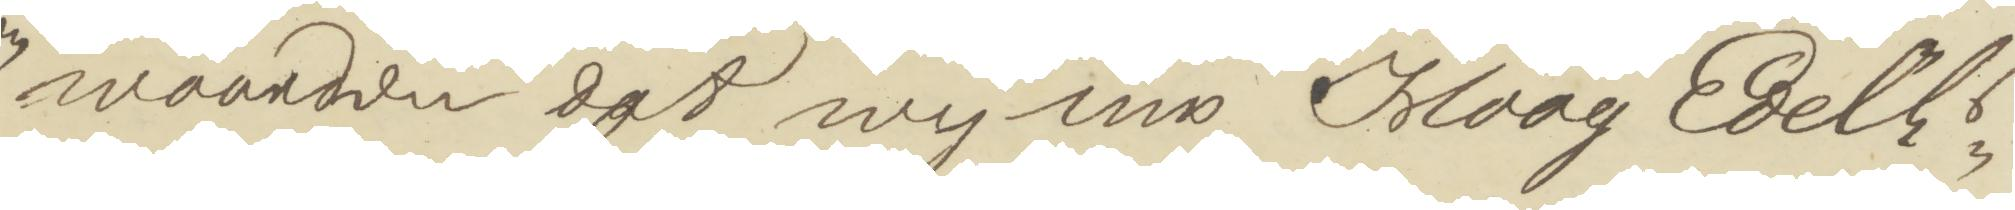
woorden dat wij uw Hoog Edelh„s
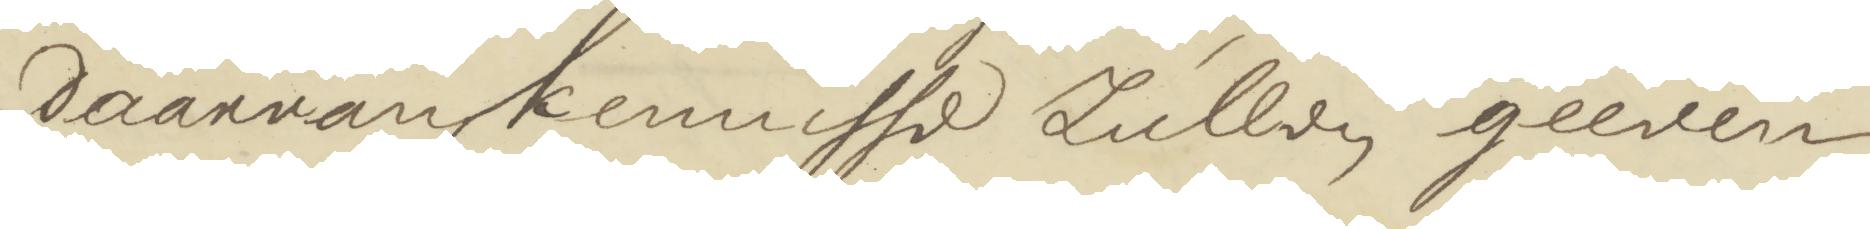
daarvan kennisse zullen geeven
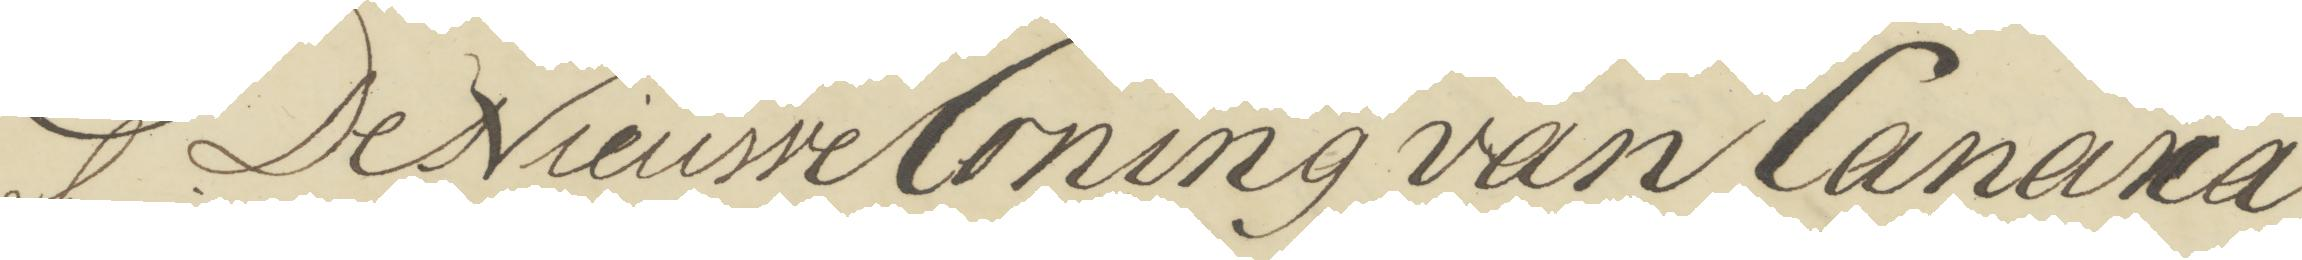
De Nieuwe Coning van Canara
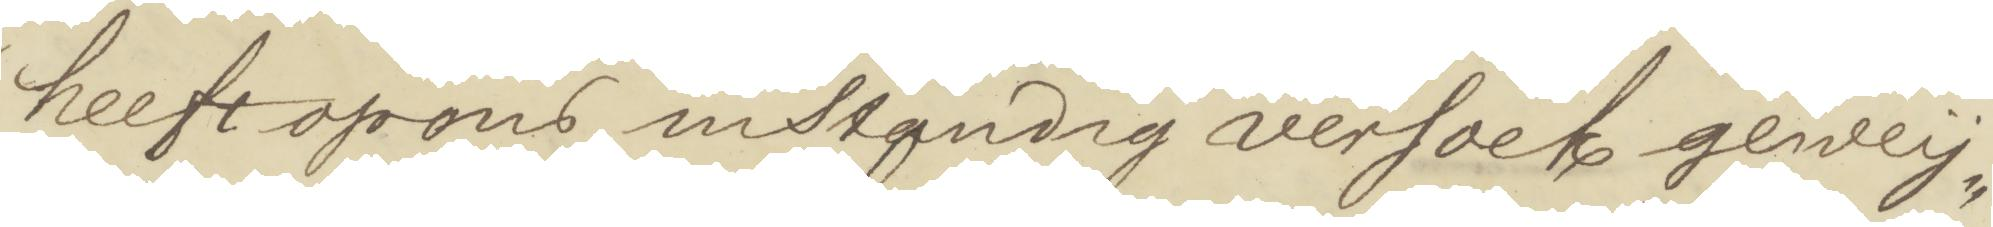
heeft op ons instandig versoek geweij„
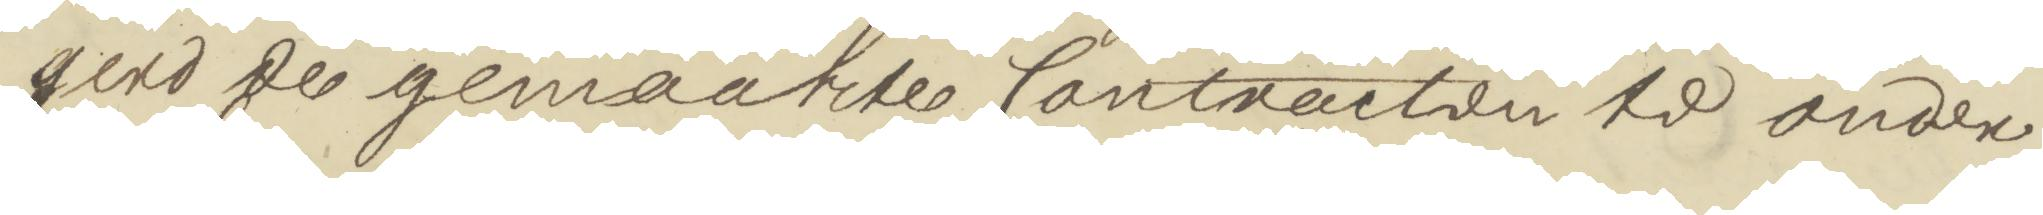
gerd de gemaakte Contracten te onder
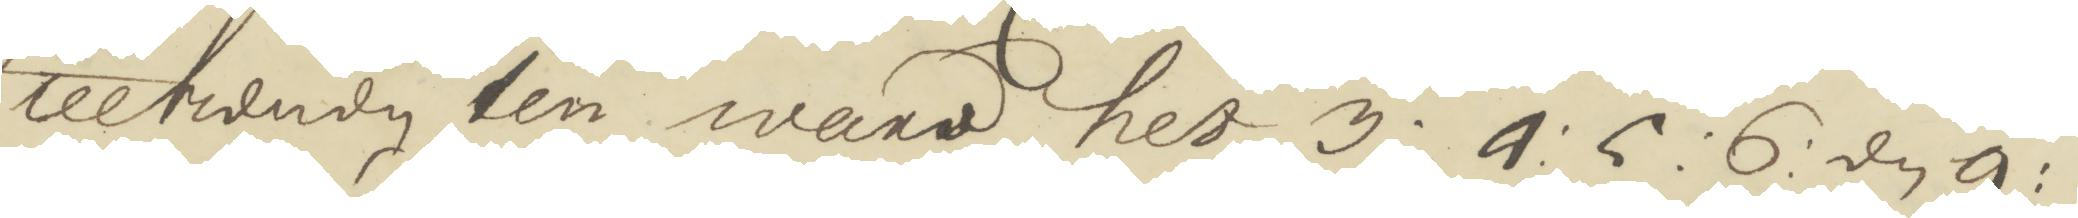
teekenen ten ware het 3: 4: 5: 6: en 9:
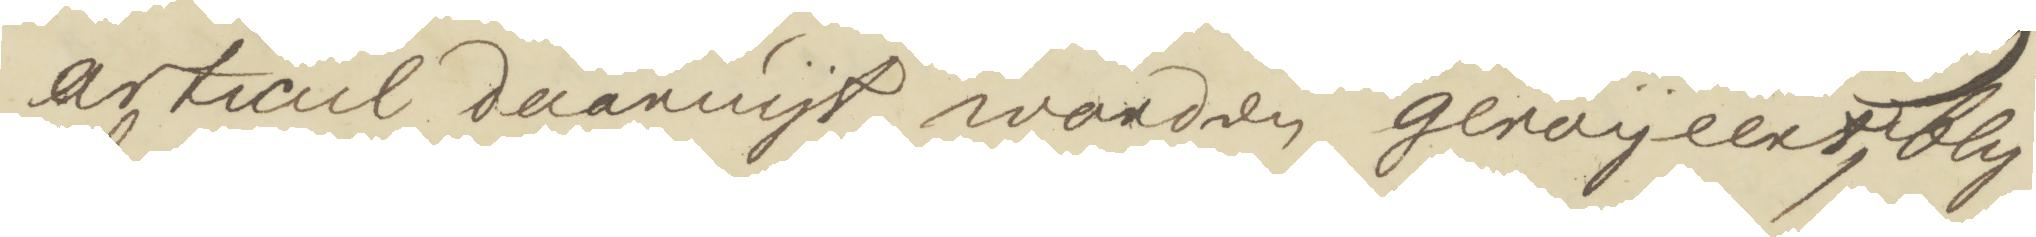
articul daaruijt worden geroijeert, blij
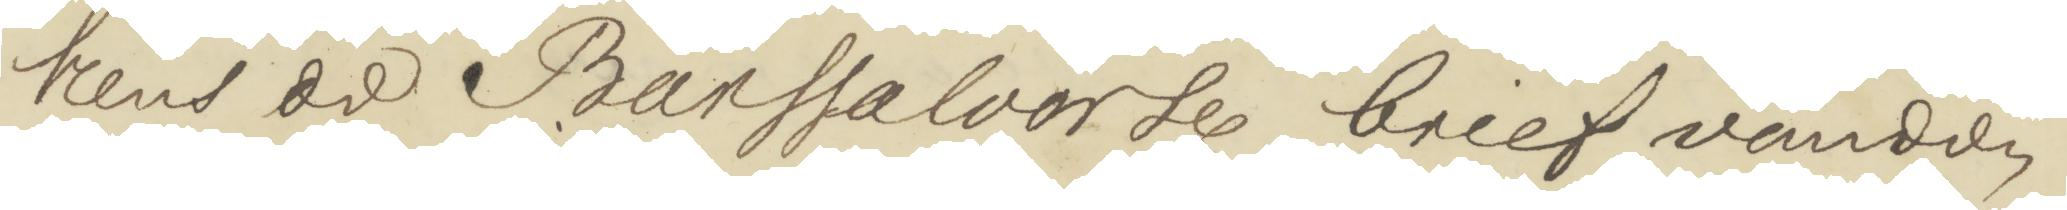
kens de Barssaloorse brief vanden
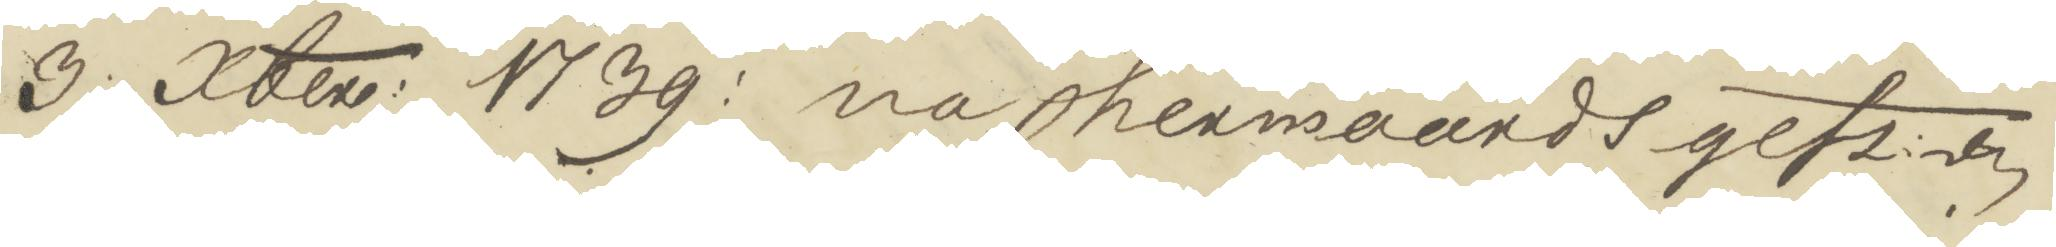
3: xber: 1739: na herwaards gesz: en
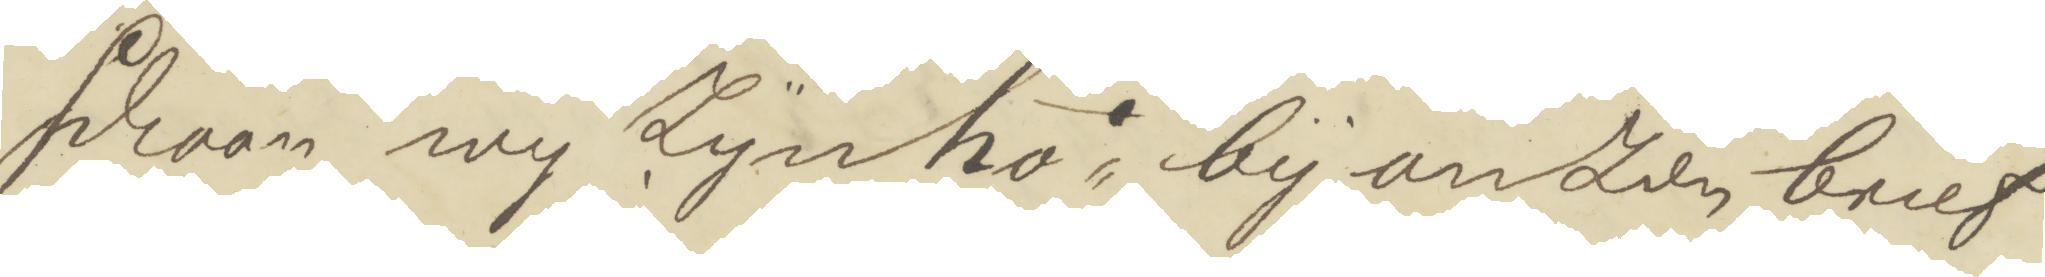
schoon wij zijn ho„t bij onzen brief
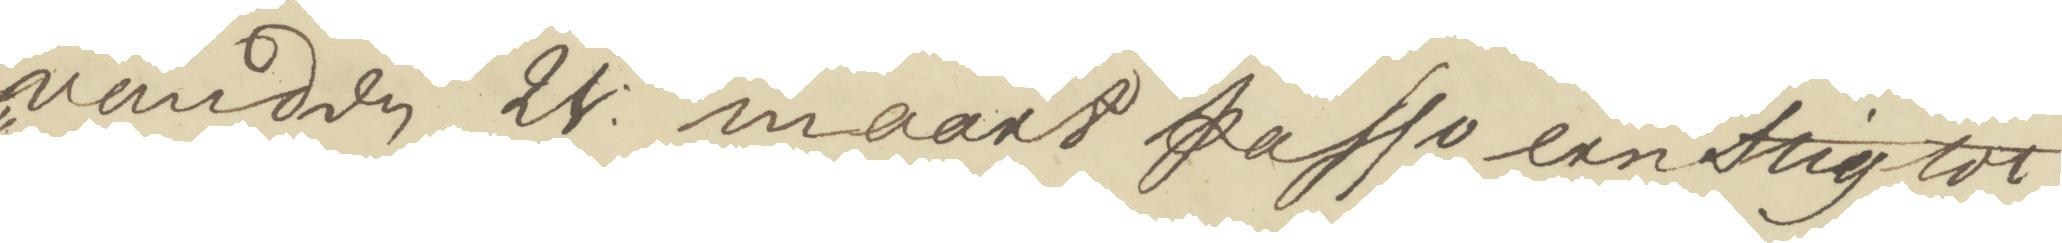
van den 21: maart pass„o ernstig tot
